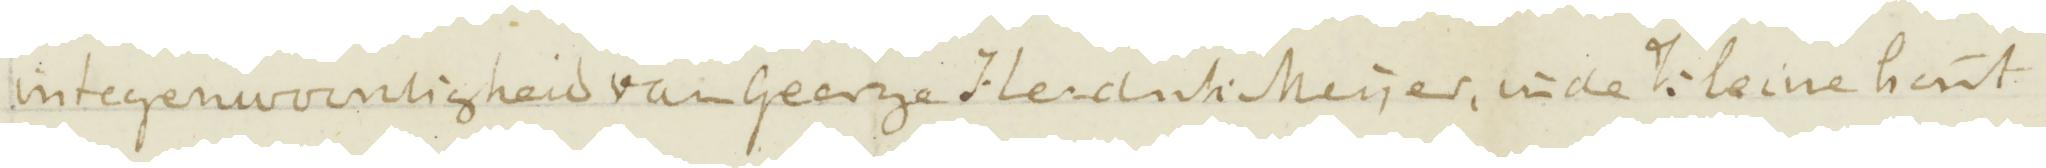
in tegenwoordigheid van George Hendrik Meijer, in de kleine hout„
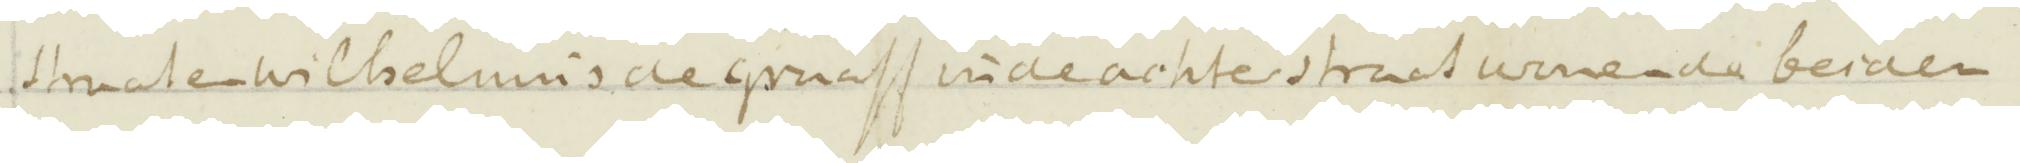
straat en Wilhelmus de graaff in de achterstraat wonende beiden
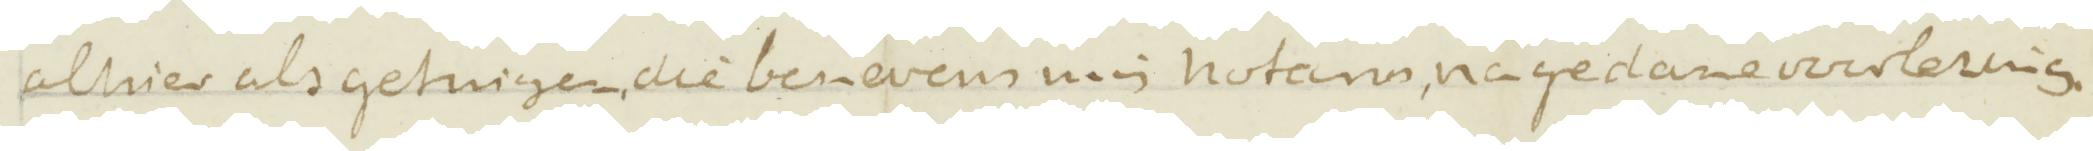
alhier als getuigen die benevens mij Notaris, na gedane voorlezing
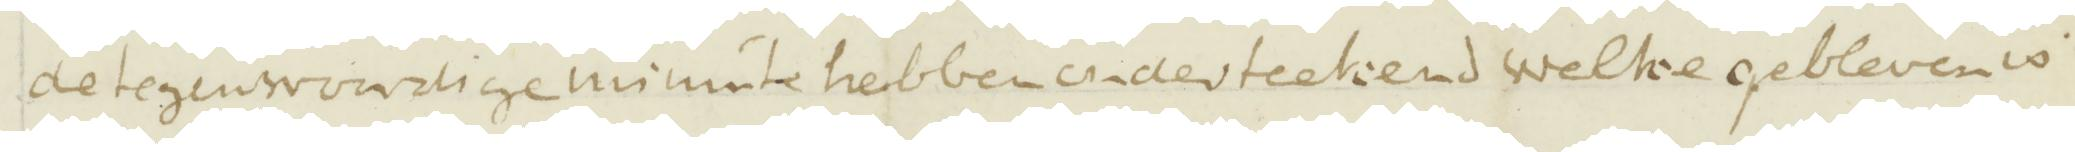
de tegenwoordige minute hebben onderteekend welke gebleven is
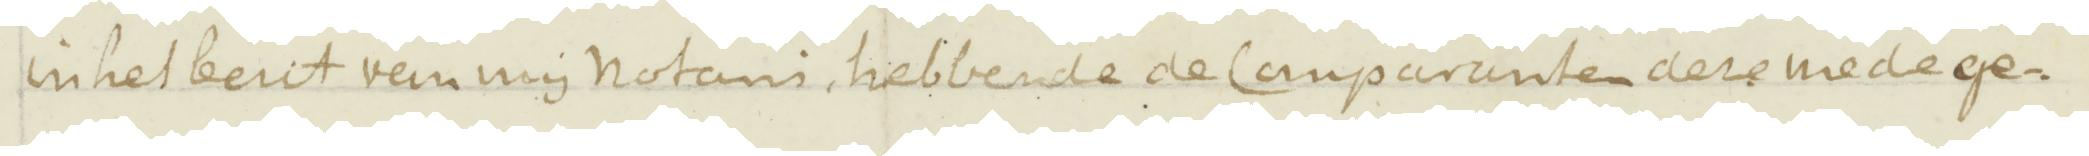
in het bezit van mij notaris, hebbende de Comparanten deze mede ge-.
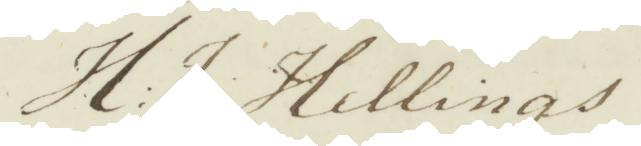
H: J: Hillings
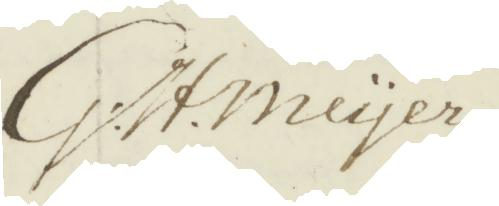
G: H: meijer
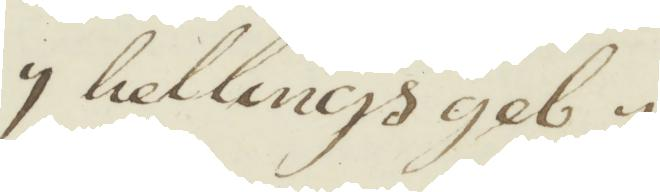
J hellings geb
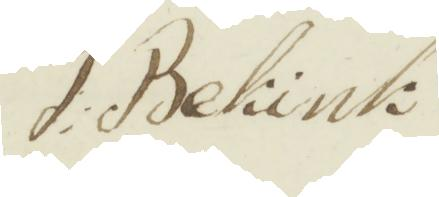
J. Bekink
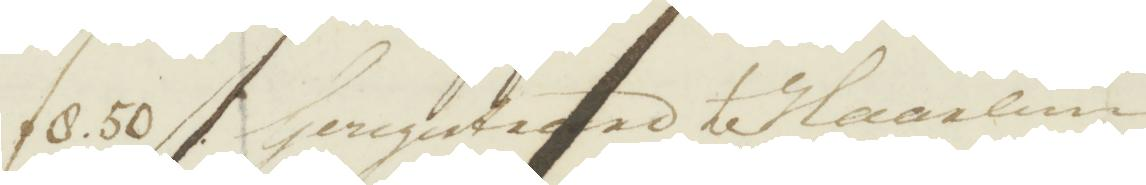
ƒ 8.50 Geregistreerd te Haarlem
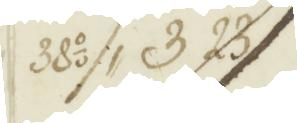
38% „ 3 23
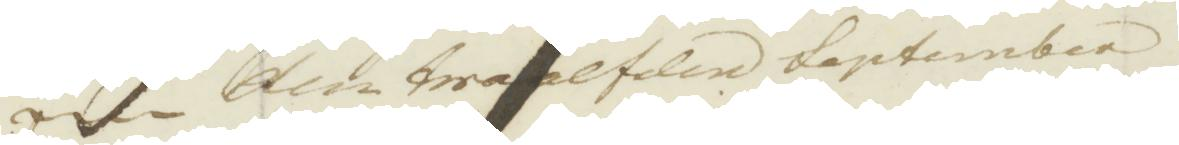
den twaalfden september
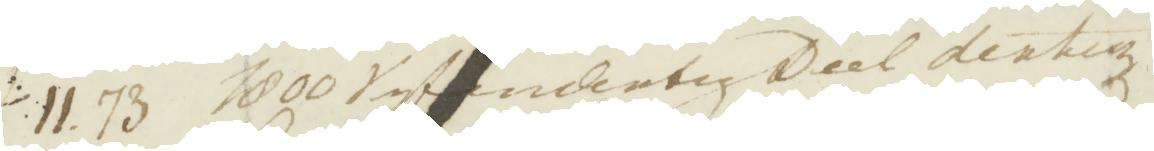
11. 73 1800 Vijfendertig Deel dertien
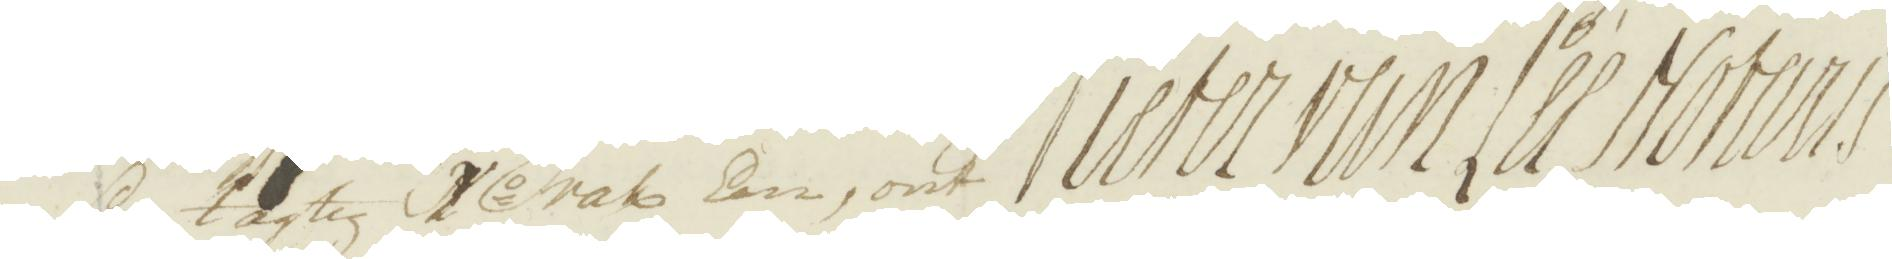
fak. tagtig N=o vak Een, ont Pieter van Lee, Notaris
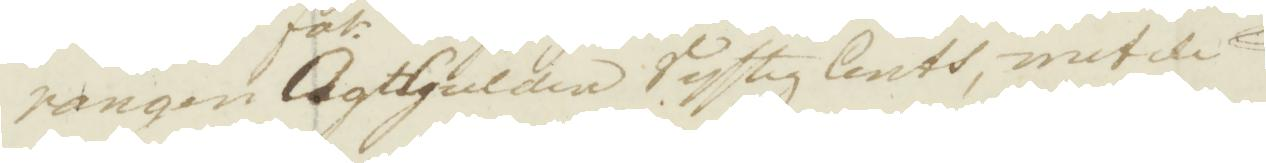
vangen Agt Gulden Vijftig Cents, met de
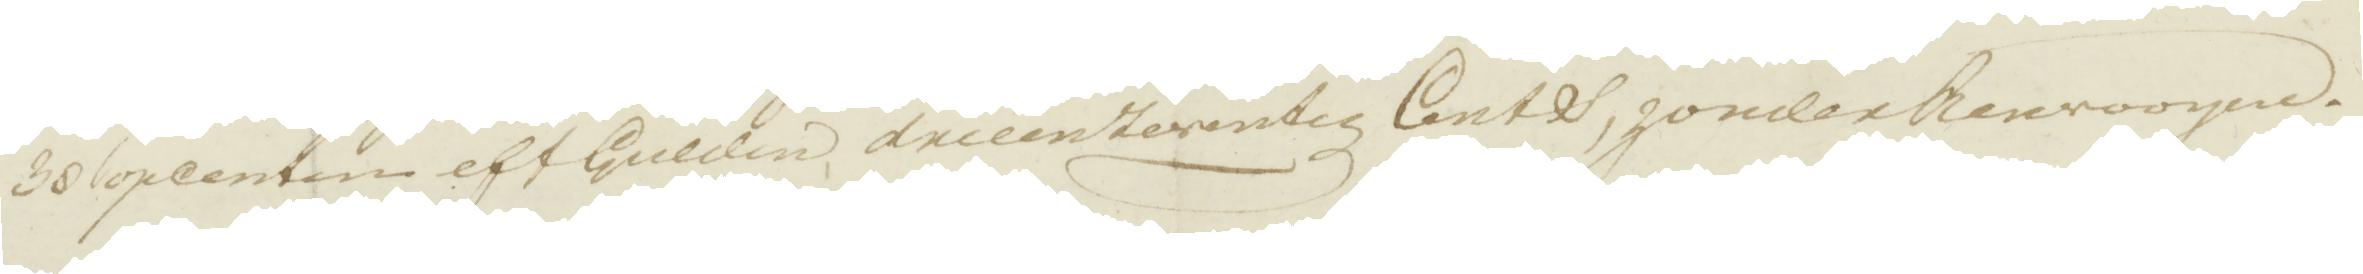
38 opcenten elf Gulden, drieenzeventig Cents, zonder Renvooyen.
